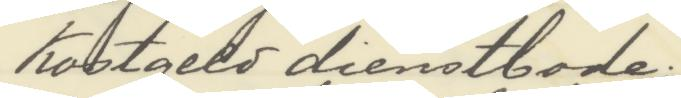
Kostgeld dienstbode;
